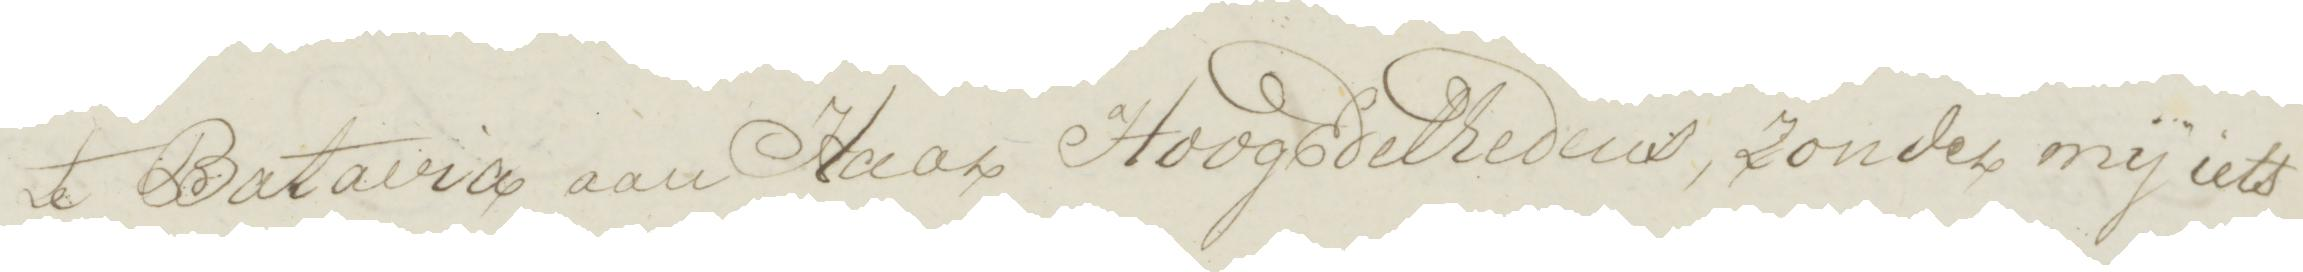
te Batavia aan Haar HoogEdelhedens, zonder mij iets
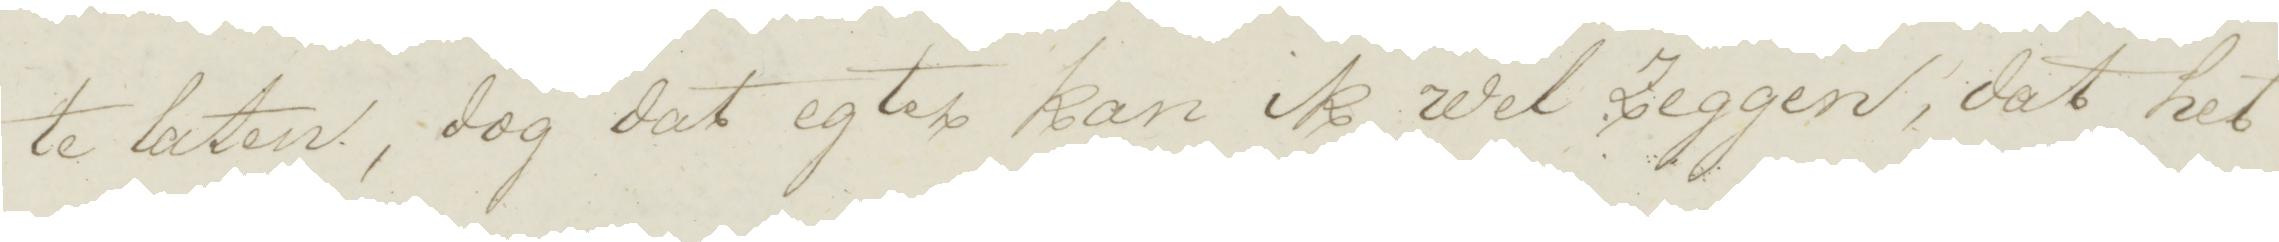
te laten, dog dat egter kan ik wel zeggen, dat het
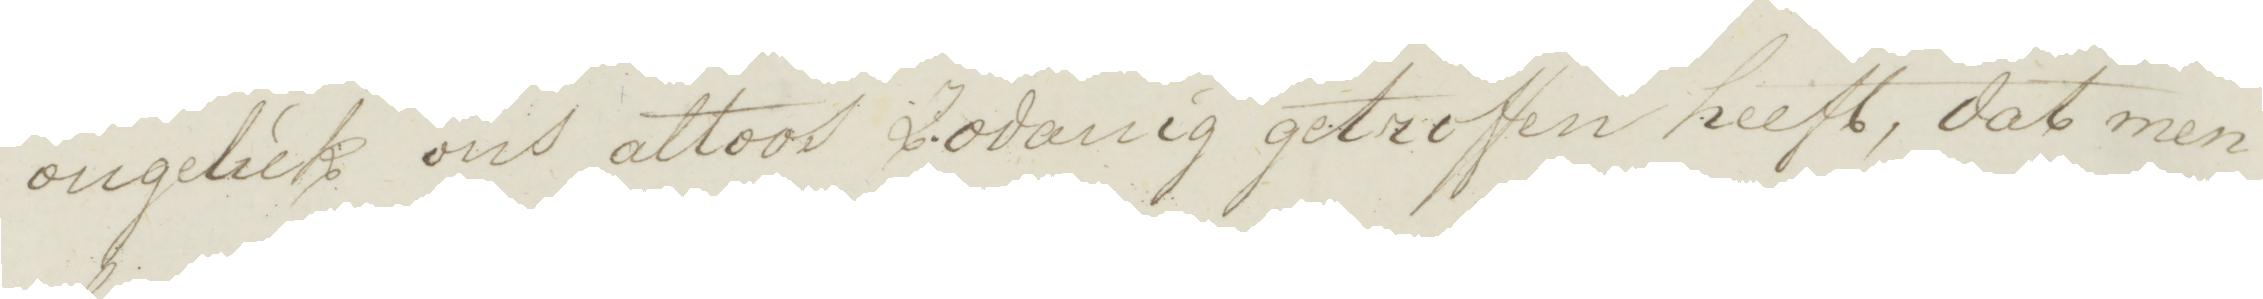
ongeluk ons altoos zodanig getroffen heeft, dat men
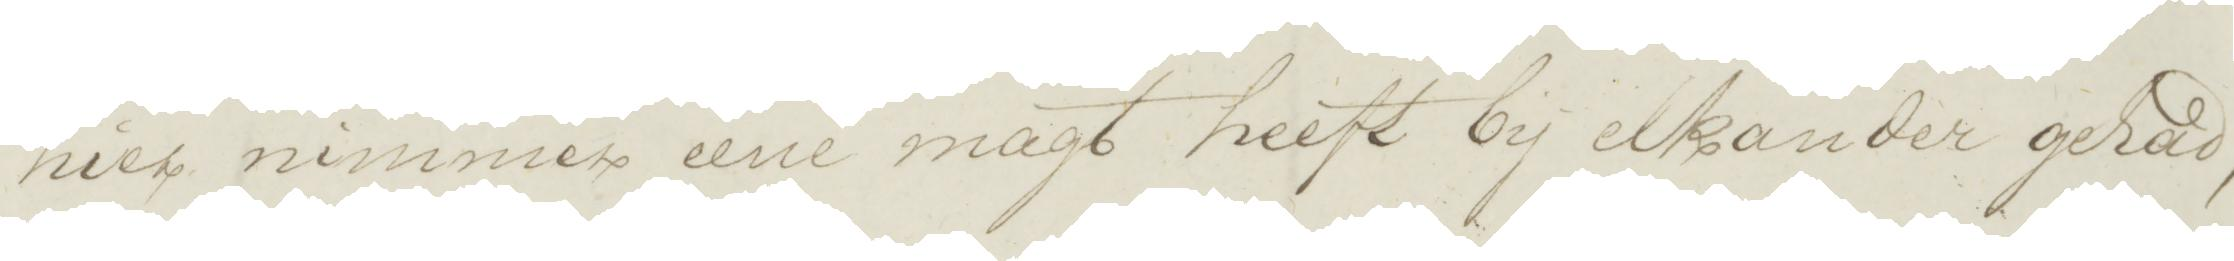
hier nimmer eene magt heeft bij elkander gehad
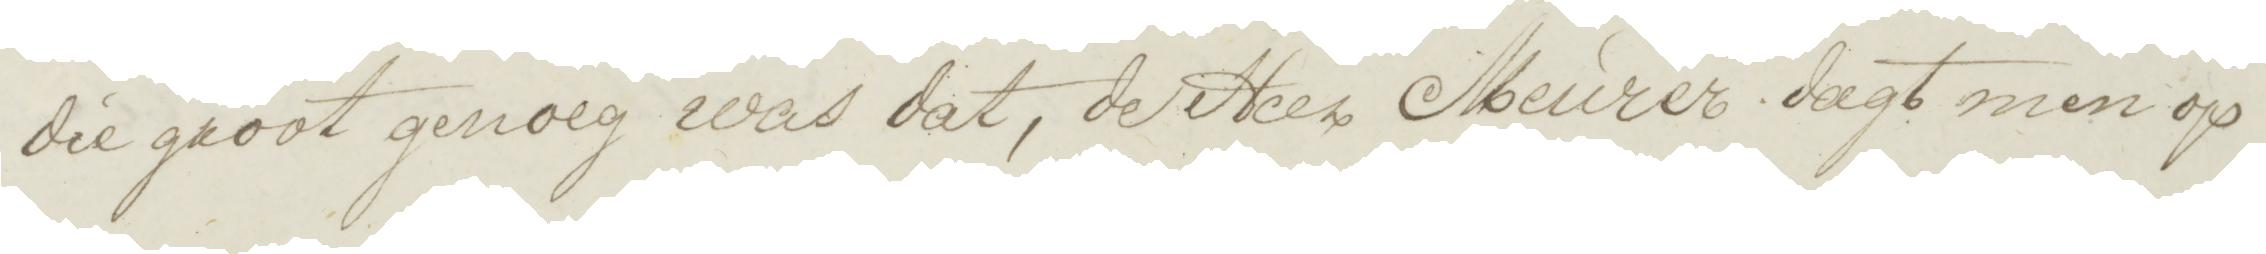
die groot genoeg was dat, de Heer Meurer dagt men op
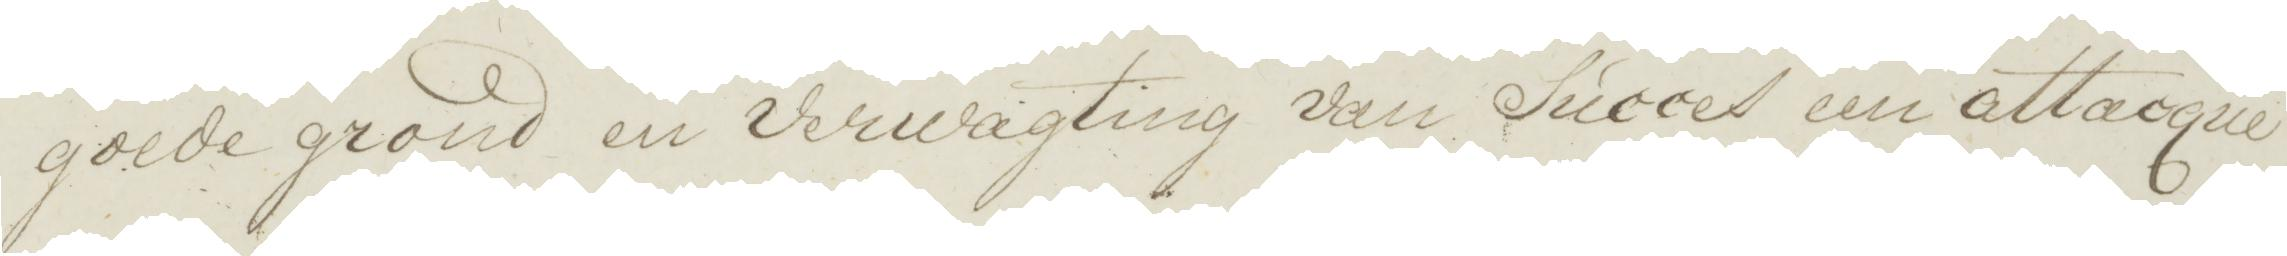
goede grond en verwagting van succes een attacque
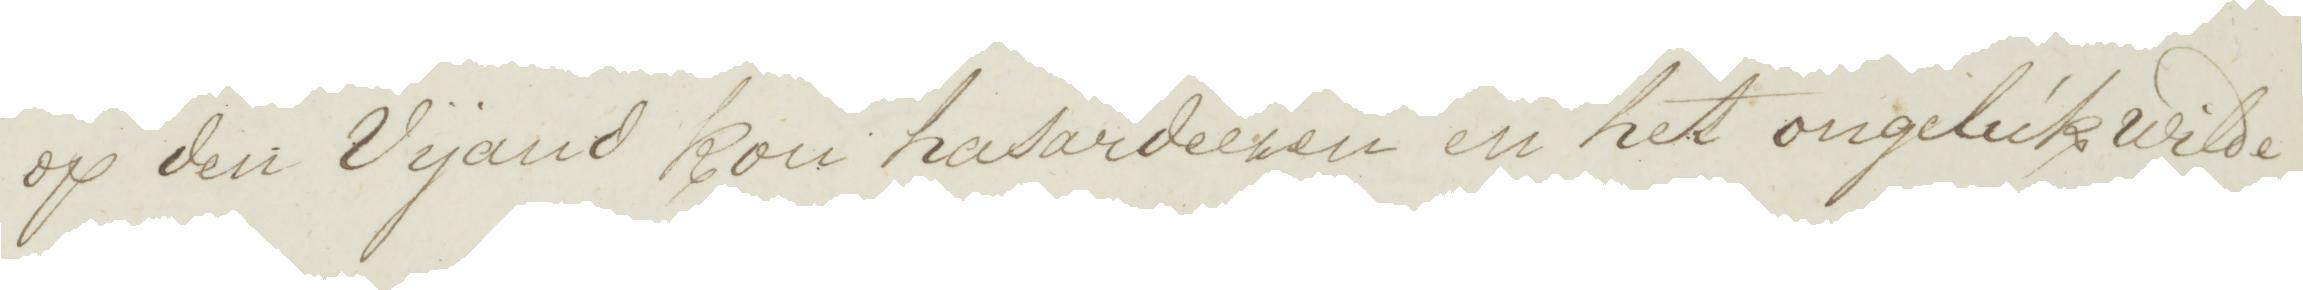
op den Vijand kon hasardeeren en het ongeluk wilde
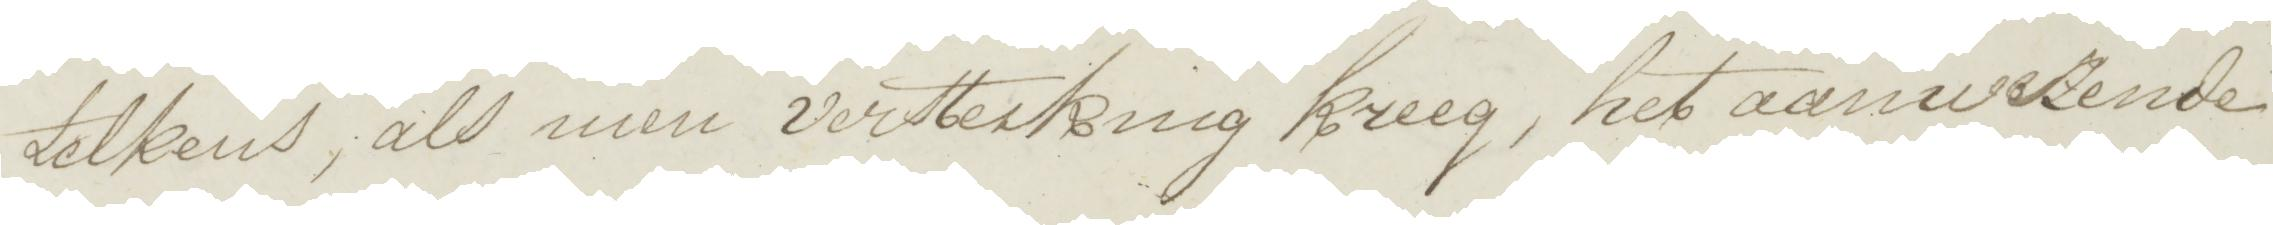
telkens, als men versterking kreeg, het aanwezende
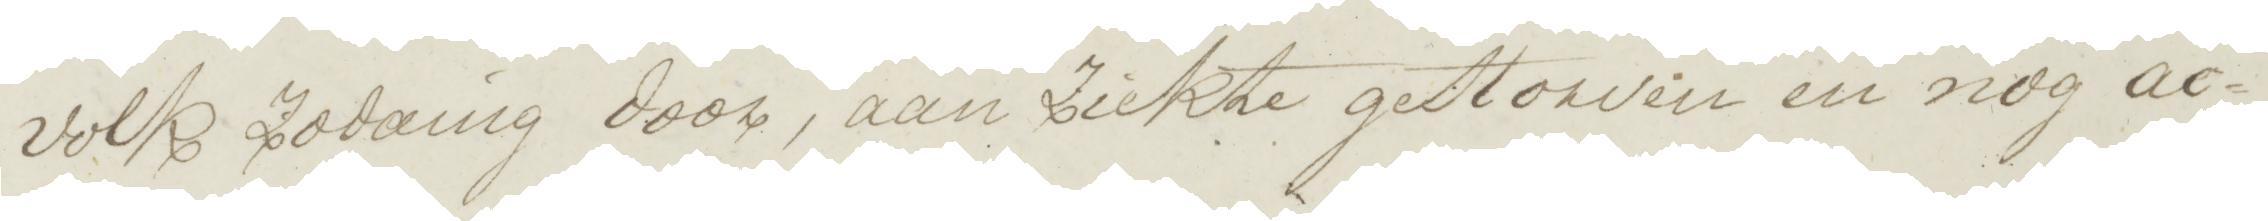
volk zodanig door, aan ziekte gestorven en nog ac=
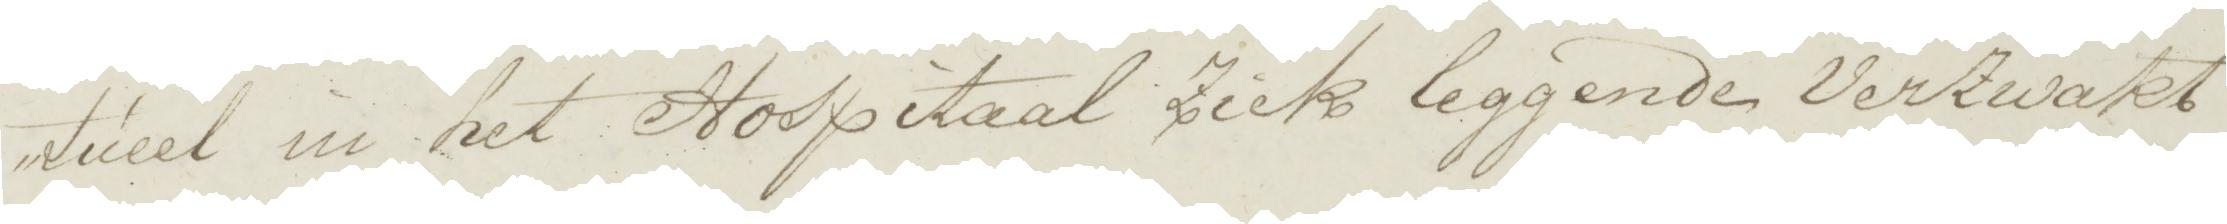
„tueel in het Hospitaal ziek leggende verzwakt
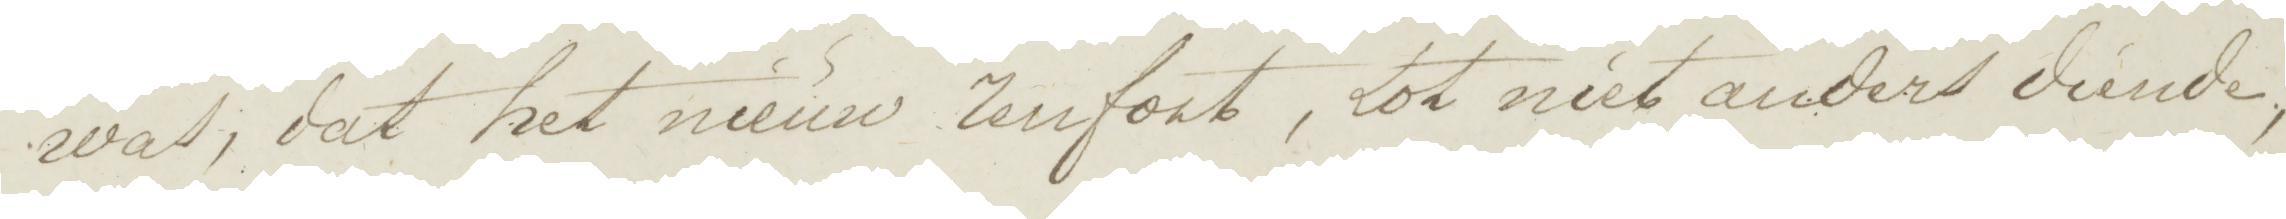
was, dat het nieuw renfort, tot niet anders diende
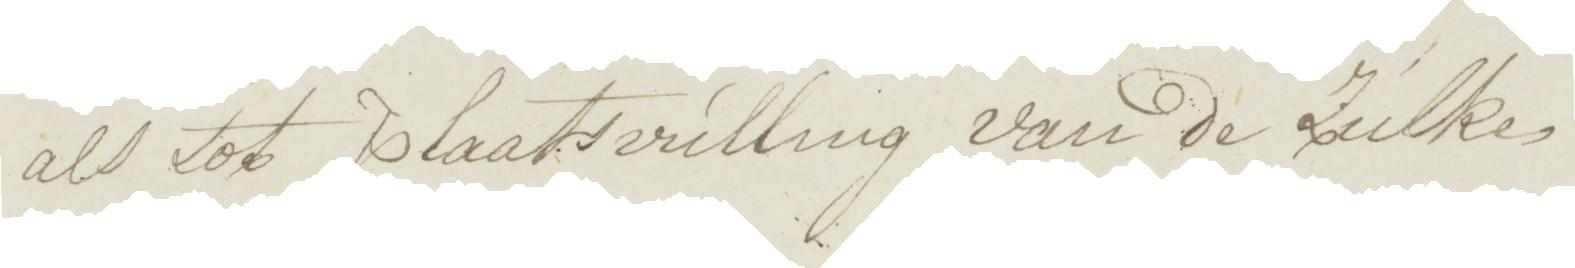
als tot plaatsvulling van de zulke
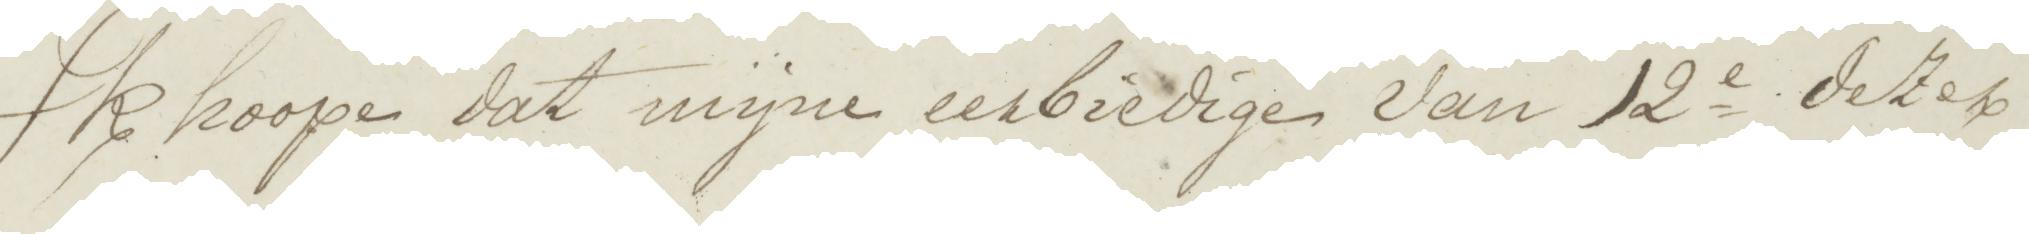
Jk hoope dat mijne eerbiedige van 12=e dezer
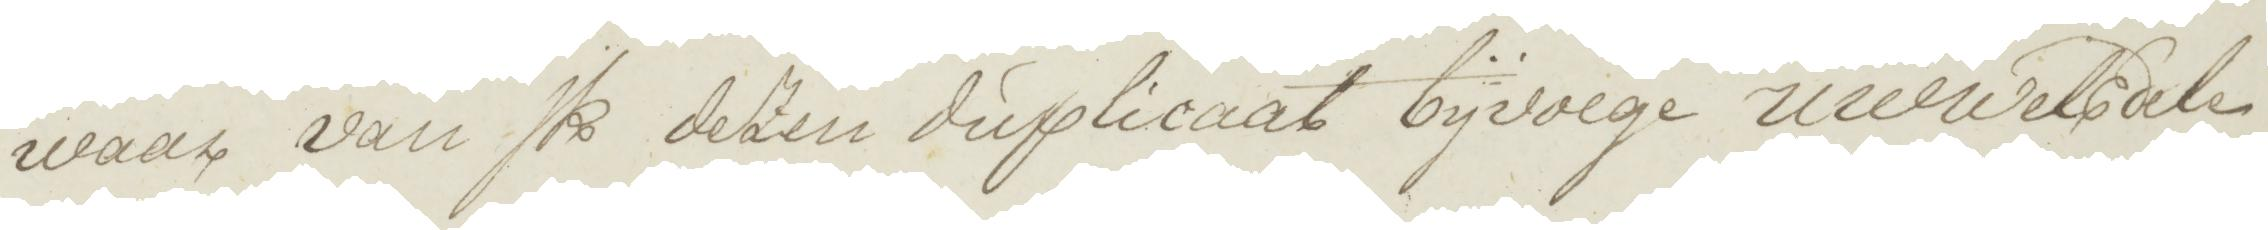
waar van jk dezen duplicaat bijvoege uwwelEdele
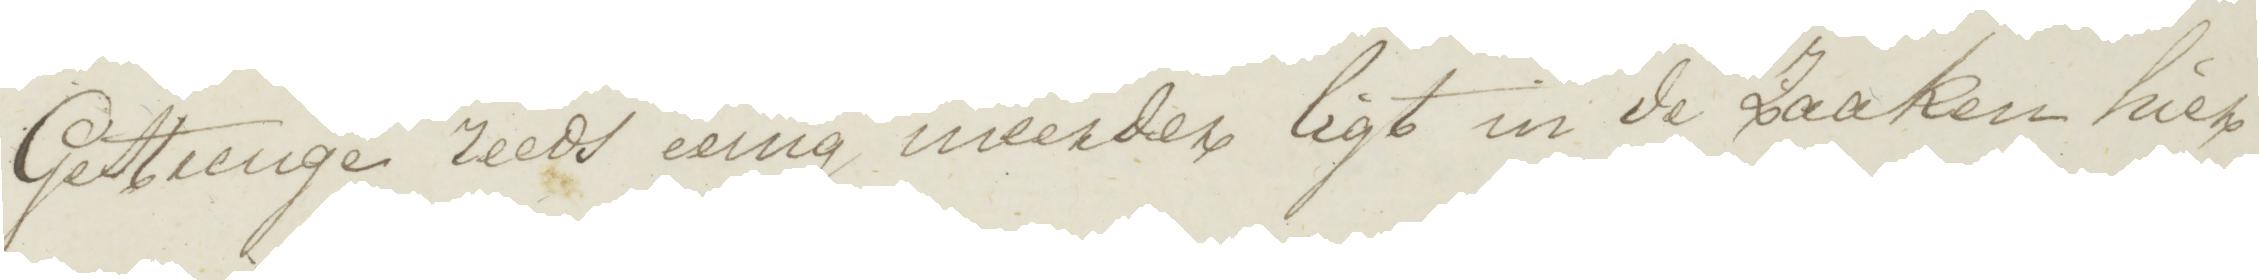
Gestrenge reeds eenig meerder ligt in de zaaken hier
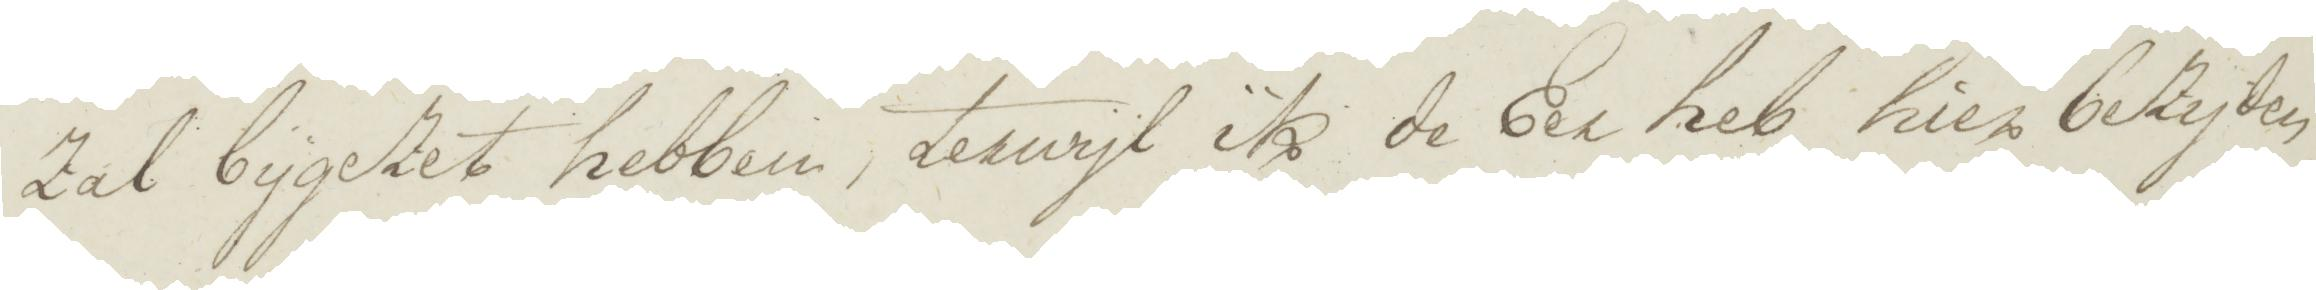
zal bijgezet hebben, terwijl ik de Eer heb hier bezijden
